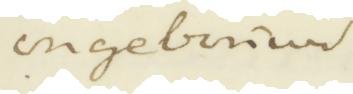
ongebouwd
